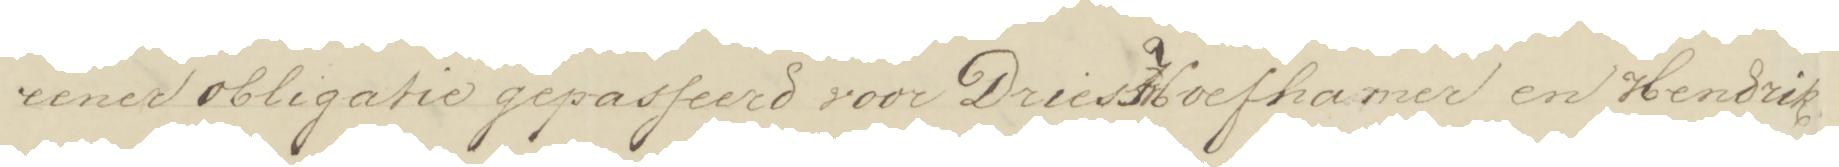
eener obligatie gepasseerd voor Dries Hoefhamer en Hendrik
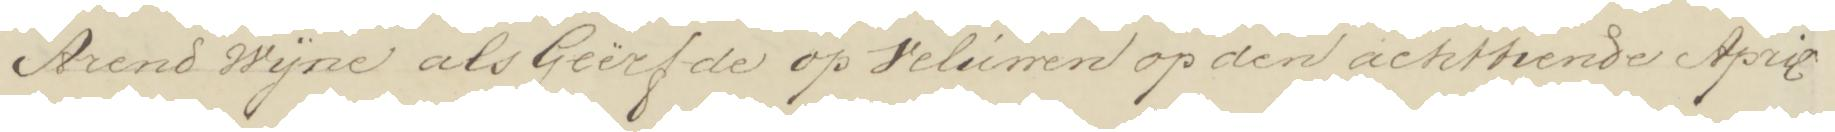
Arend Wijne als Geërfde op Veluwen op den achttiende April
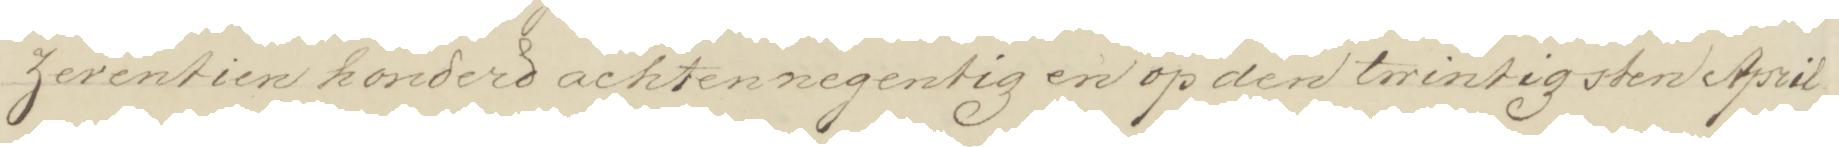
Zeventien honderd achtennegentig en op den twintigsten April
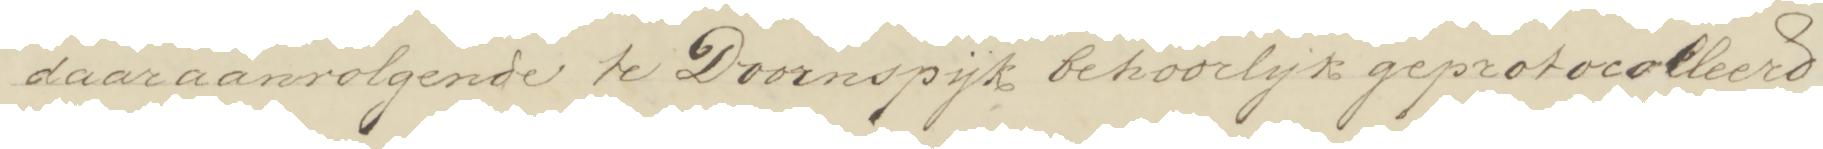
daar aanvolgende te Doornspijk behoorlijk geprotocolleerd
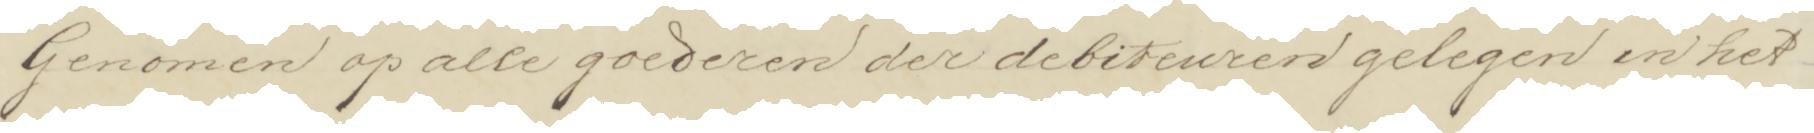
genomen op alle goederen der debiteuren gelegen in het
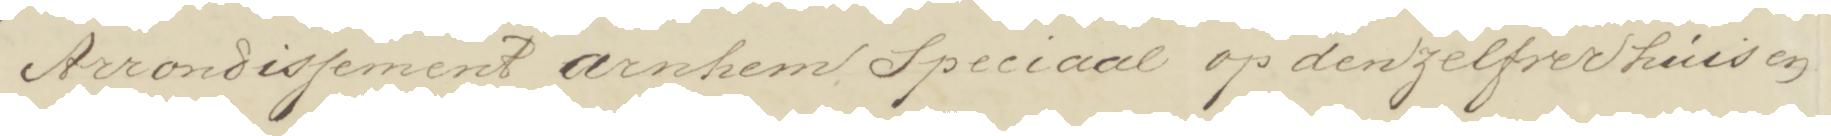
Arrondissement arnhem speciaal op den zelfver huis en
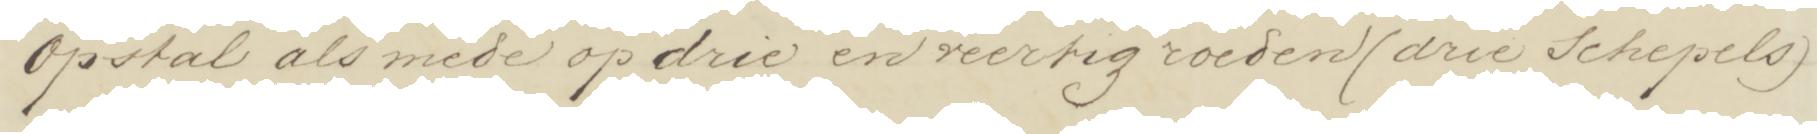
opstal als mede op drie en veertig roeden (drie schepels)
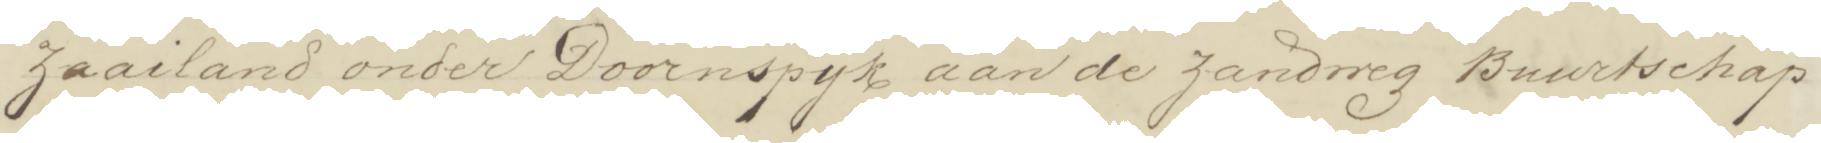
Zaailand onder Doornspijk aan de zandweg Buurtschap
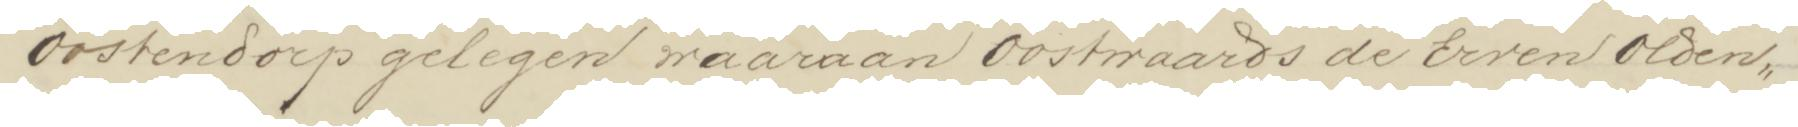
oostendorp gelegen waaraan Oostwaards de Erven olden„
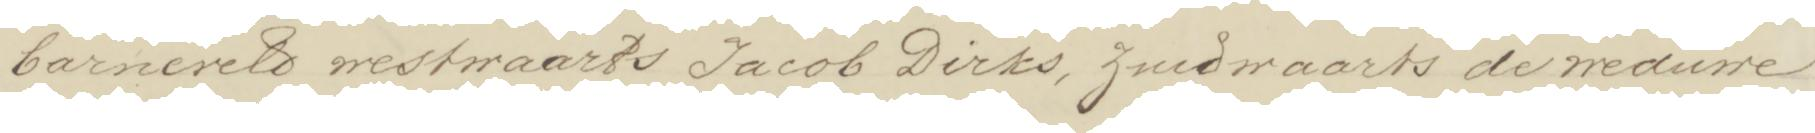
barneveld westwaarts Iacob Dirks, Zuidwaarts de weduwe
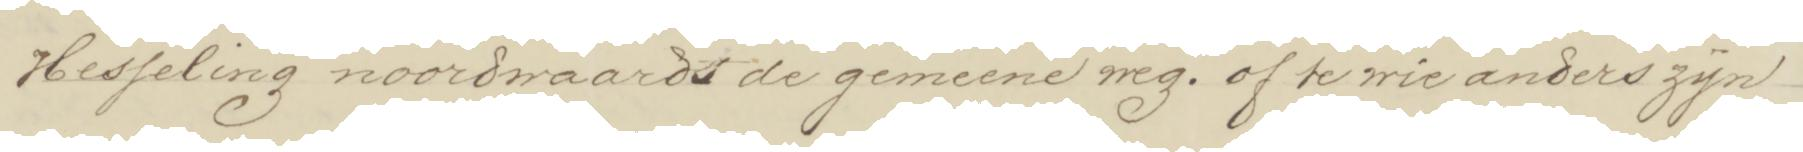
Hesseling noordwaards de gemeene weg. of te wie anders zijn
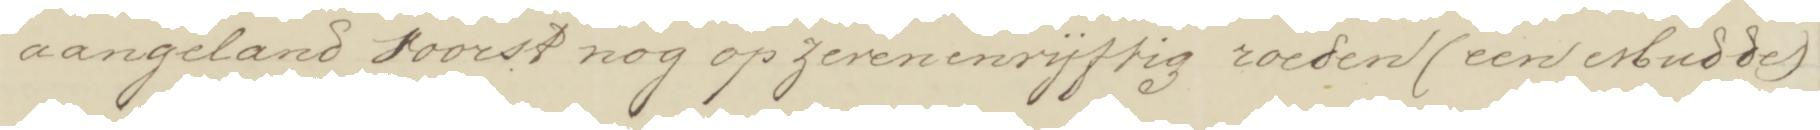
aangeland voorst nog op zevenenvijftig roeden (een Mudde)
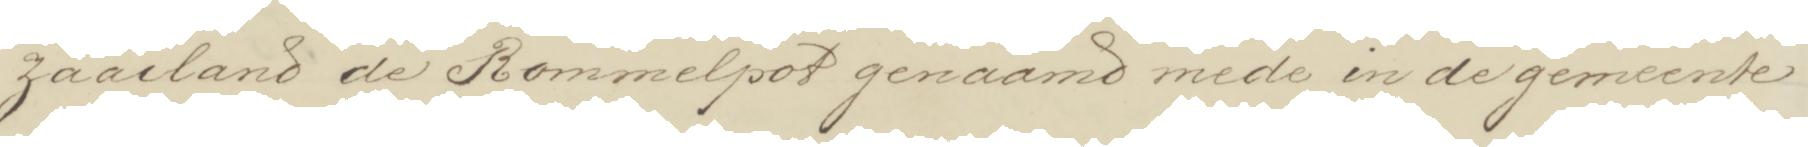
Zaailand de Rommelpot genaamd mede in de gemeente
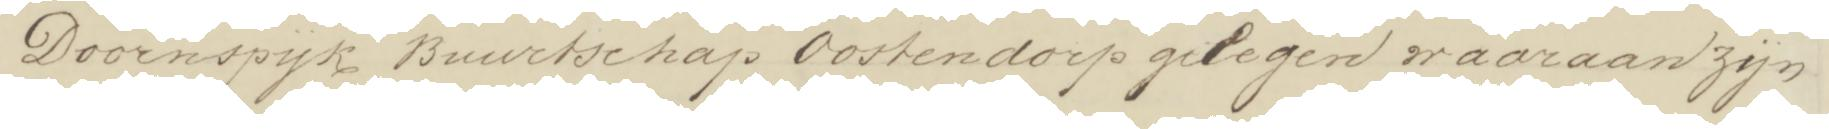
Doornspijk Buurtschap Oostendorp gelegen waaraan zijn
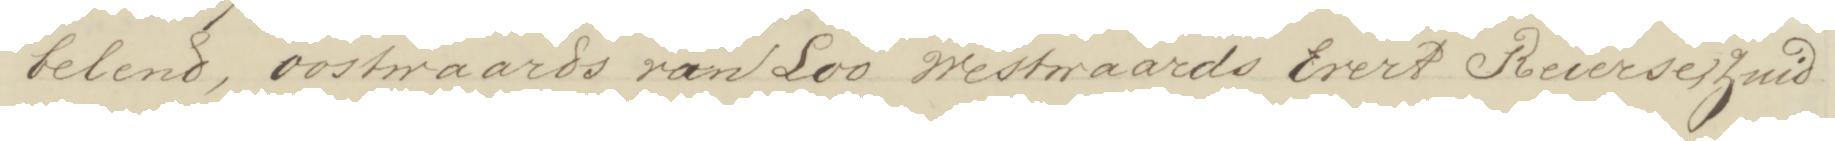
belend, oostwaards van Loo westwaards Evert Reierse, Zuid
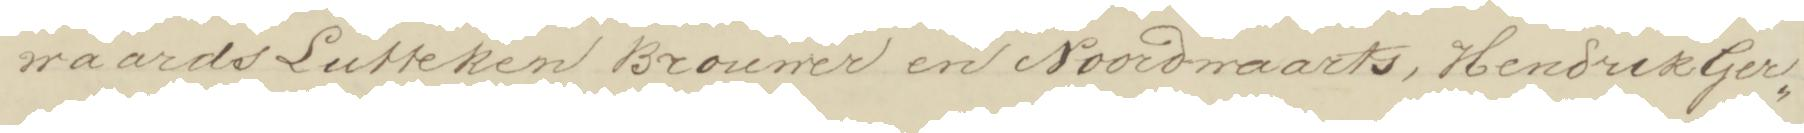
waards Lutteken Brouwer en Noordwaarts, Hendrik Ger„
